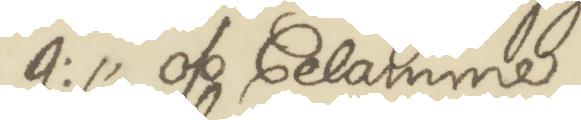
4: „ op celamme
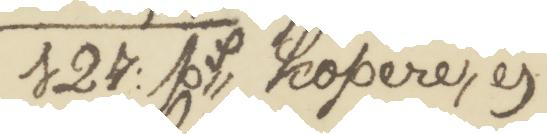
127: p„s kopere, en
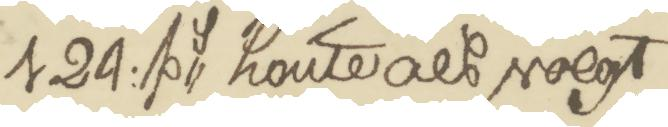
124. p„s houte als volgt
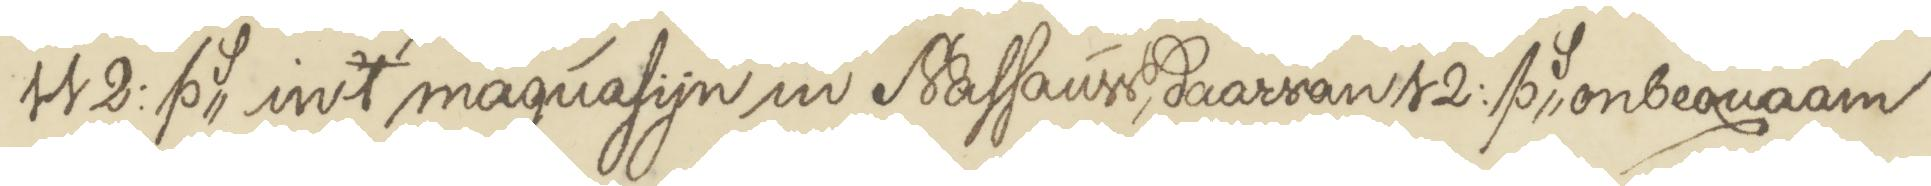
112: p„s in ’t maguasijn in Nassauw, daarvan 12: p„s onbequaam
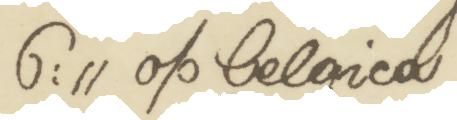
6: „ op belgica
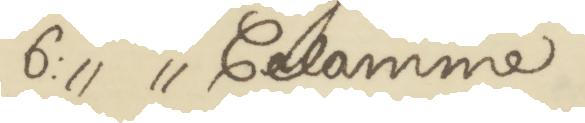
6: „ „ Celamme
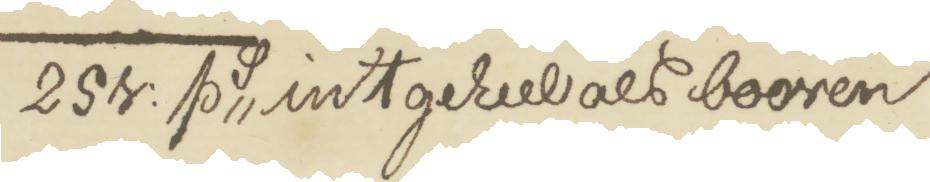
251: p„s in ’t geheel als booven
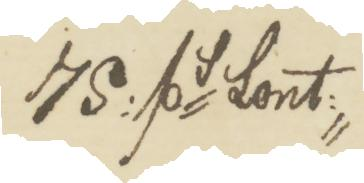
75. p=s lont:„
